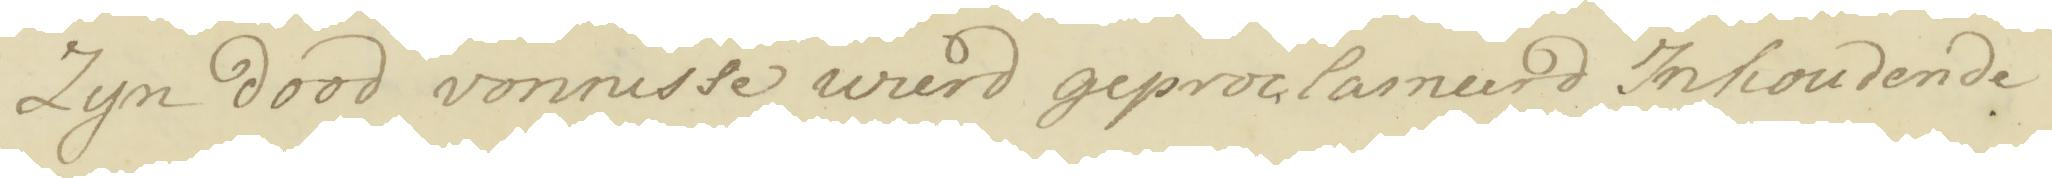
Zyn dood vonnisse wierd geproclameerd Inhoudende
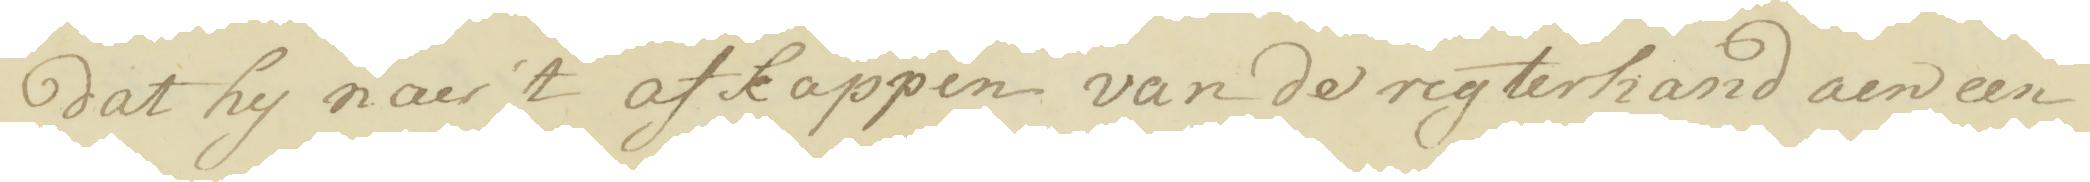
dat hy naer ’t afkappen van de rigterhand aen een
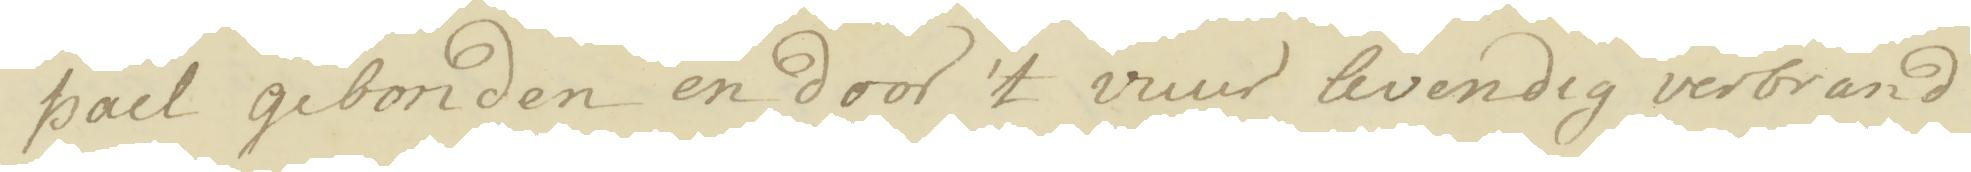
pael gebonden en door ’t vuur levendig verbrand
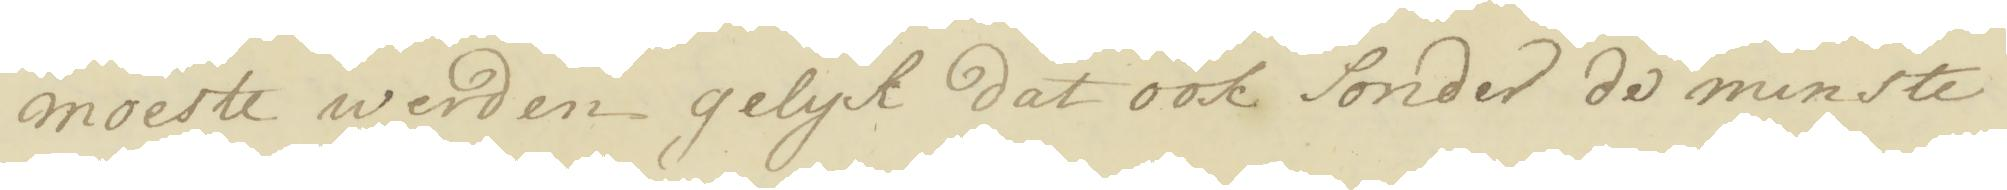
moeste werden gelyk dat ook Sonder de minste
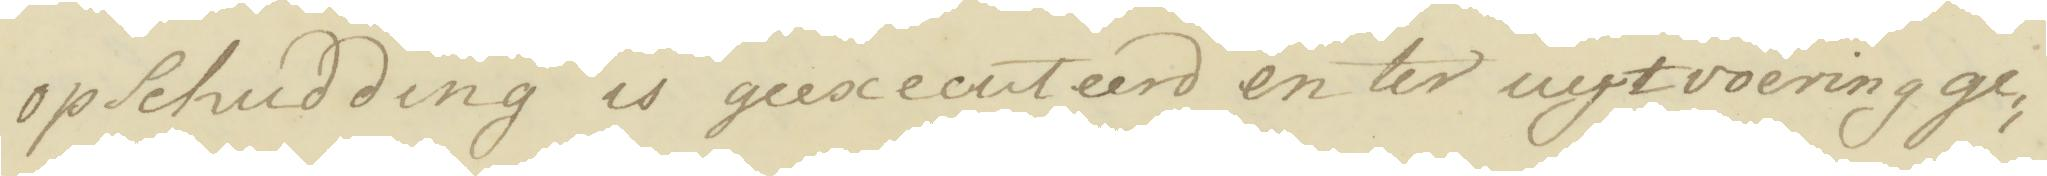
op Schudding is geexecuteerd en ter uytvoering ge„
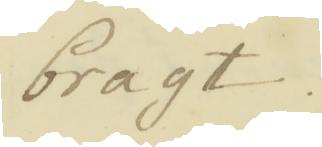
bragt.
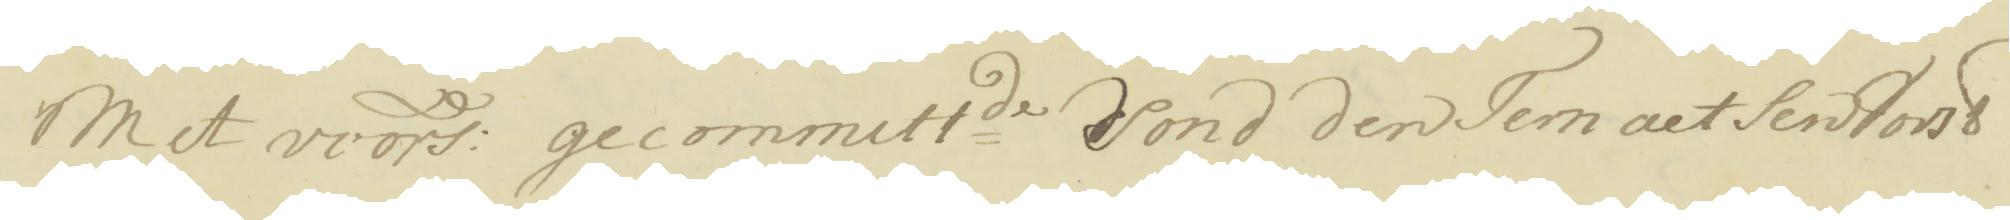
Met voors: gecommitt=de Sond den Ternaetsen Vorst
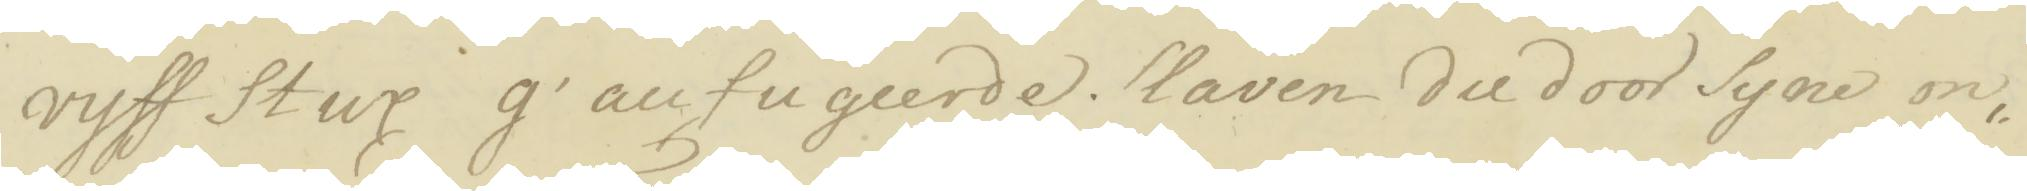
vyff stux g’aufugeerde Slaven die door Syne on„
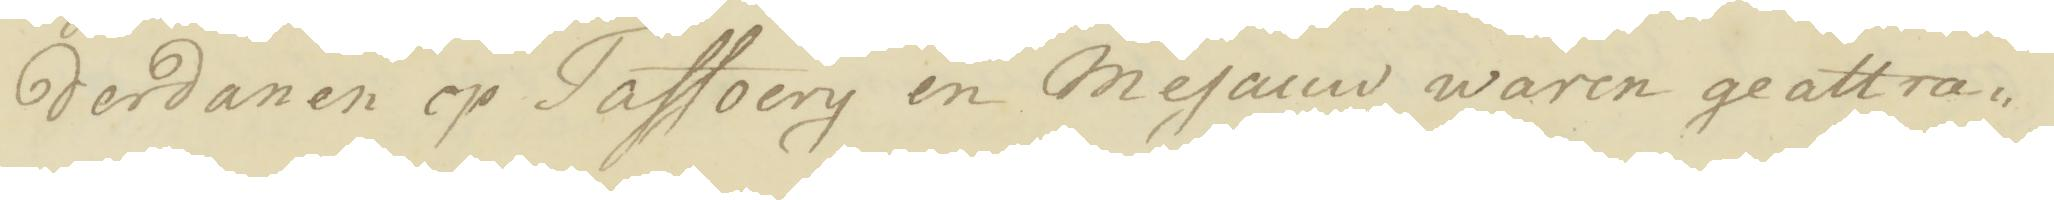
derdanen op Taffoery en Mejauw waren geattra„
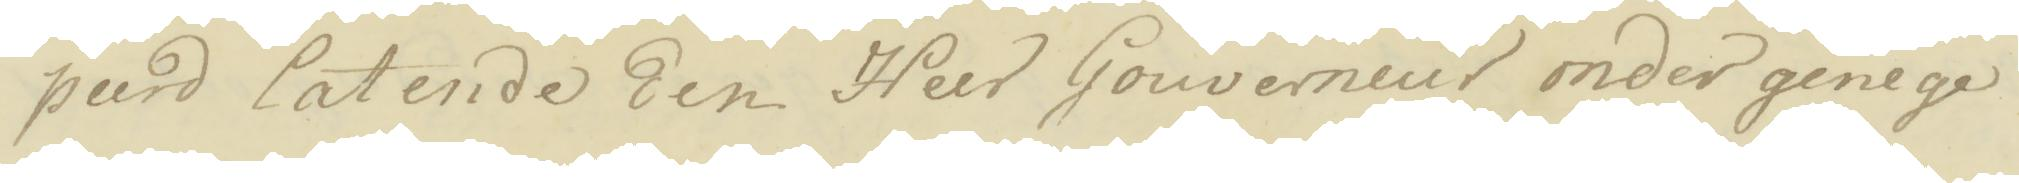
peerd latende ten Heer Gouverneur onder genege
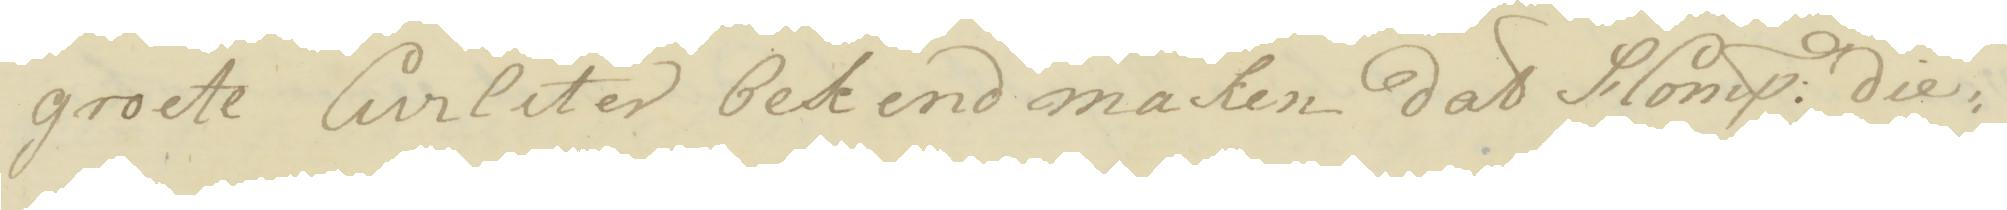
groete Curliter bekend maken dat S'Comp:e die„
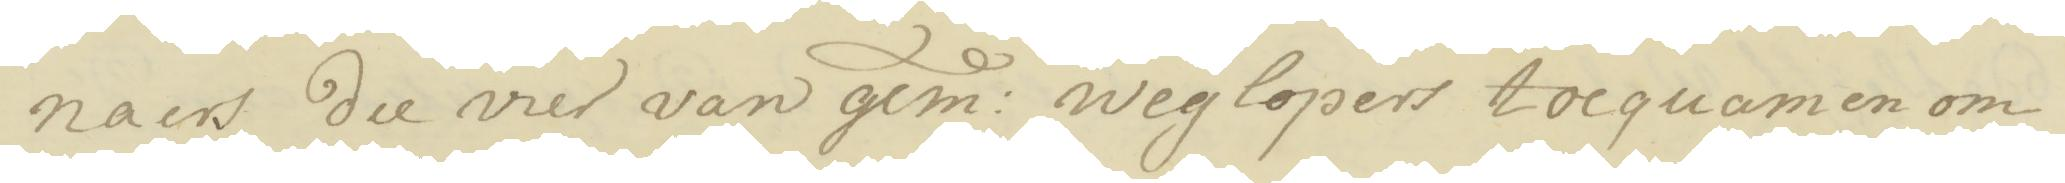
naers die vier van gem: weglopers toequamen om
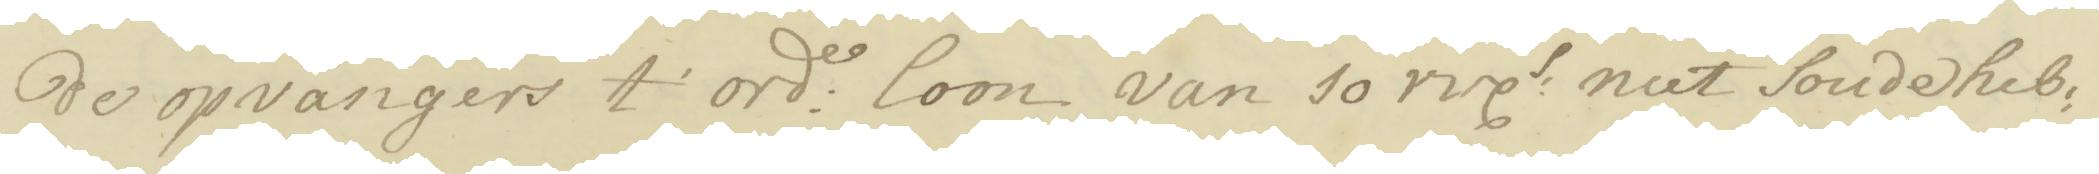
de op vangers t' ord:e loon van 10 rix:s niet Soude heb„
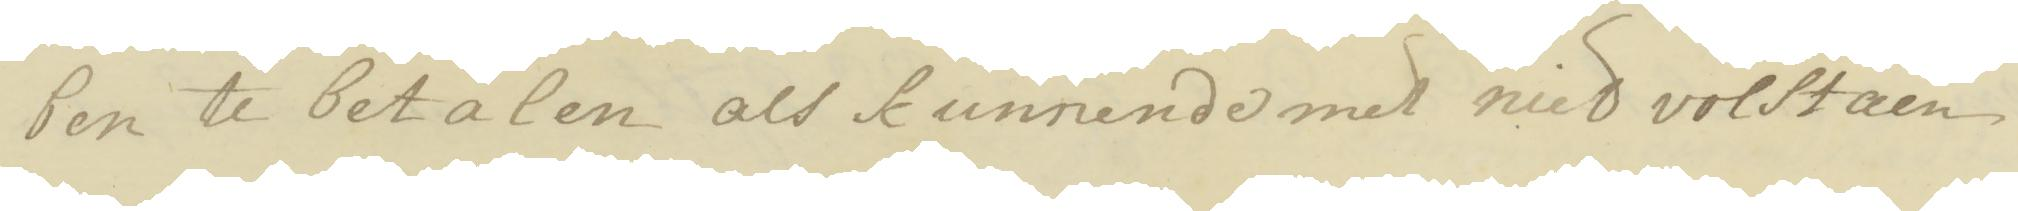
ben te betalen als kunnende met niet volstaen
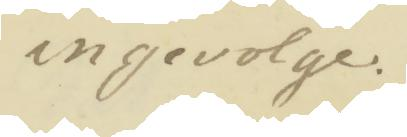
in gevolge.
